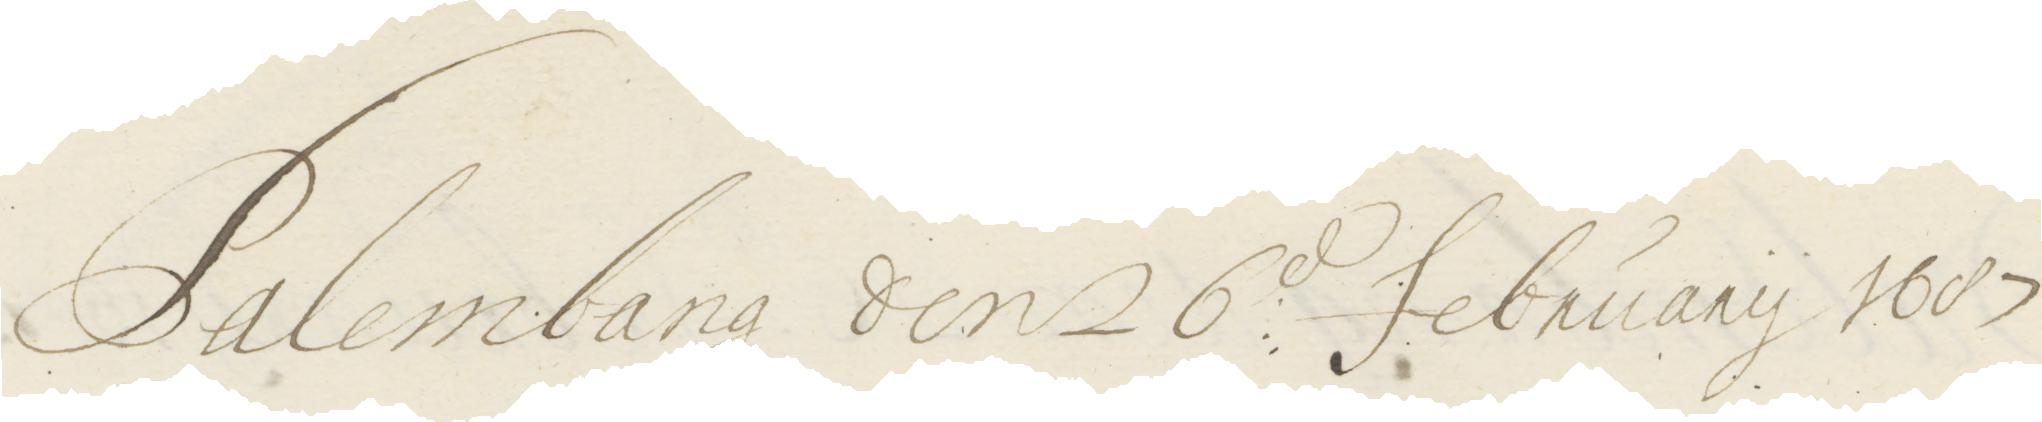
Palembang den 26:e Febuarij 1687.
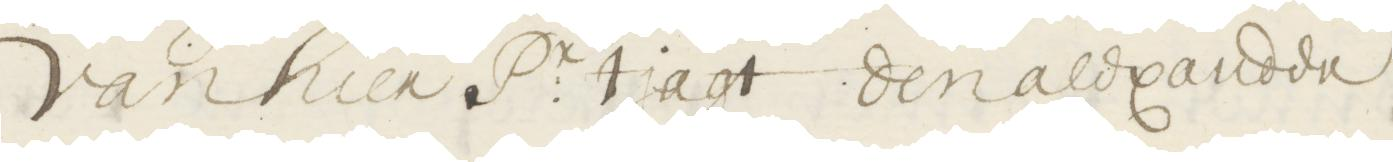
van hier P:r t jagt den alexander
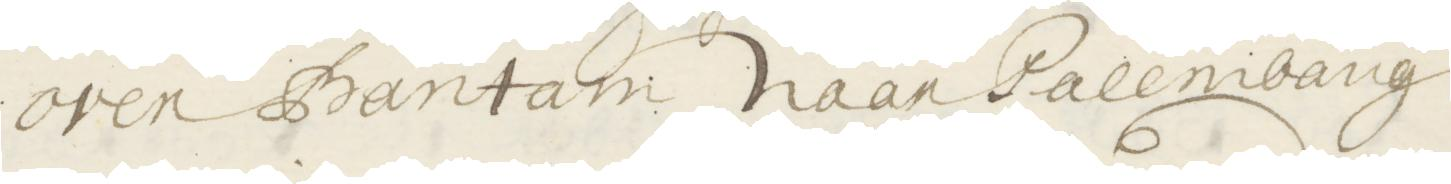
over Bantam naar Palembang
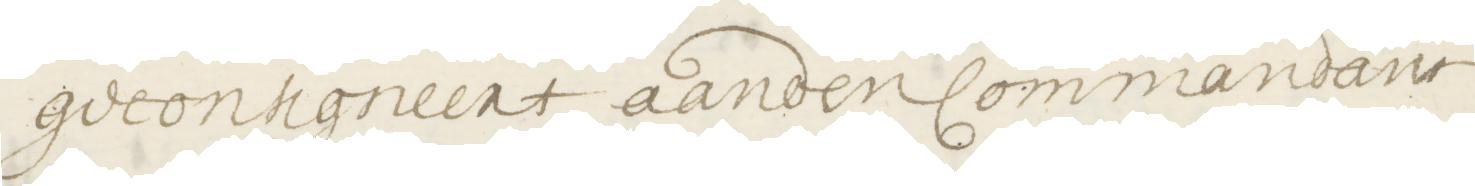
geconsigneert aan den Commandant
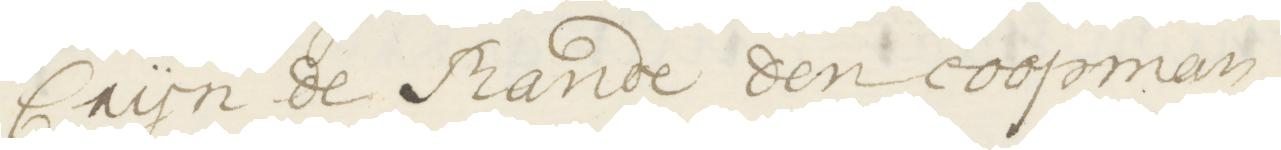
Crijn de Rande den coopman
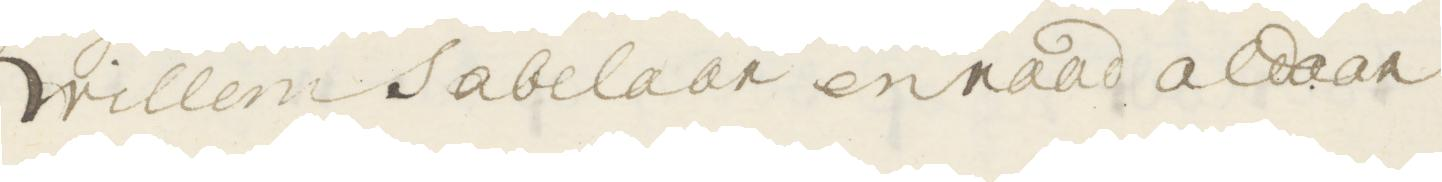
Willem Sabelaar en raad aldaar
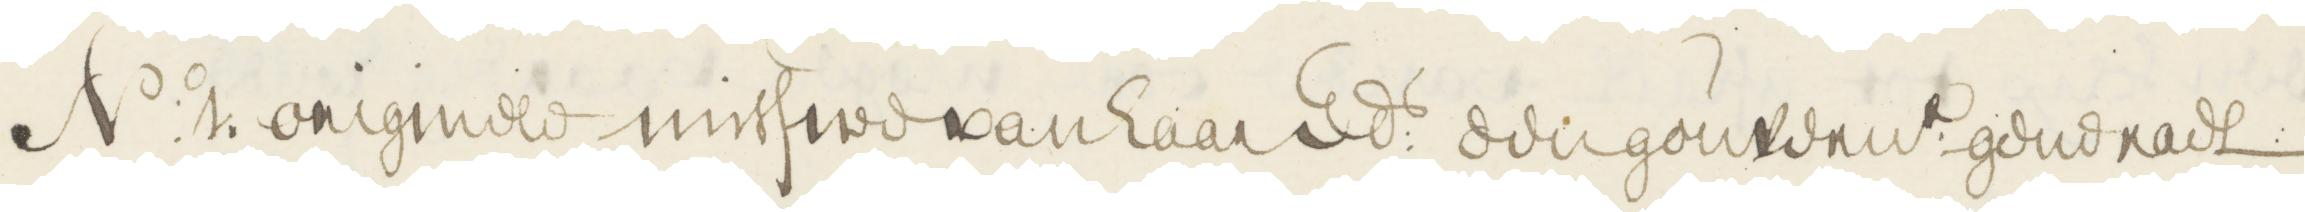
N:o 1. originele missive van haar Ed:s den gouvern:r generael:
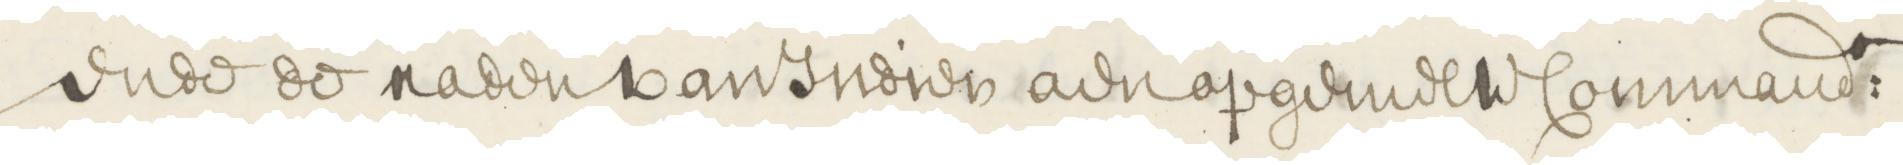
ende de raden van Indien aen op gemelte Command:t
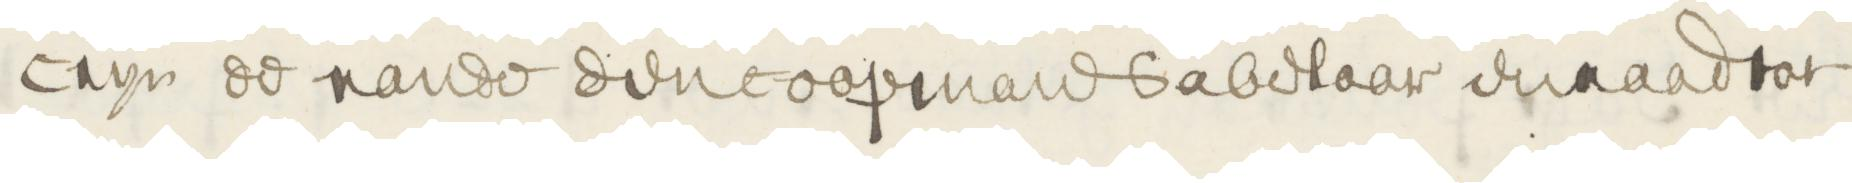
crijn de rande den coopman sabelaar en raad tot
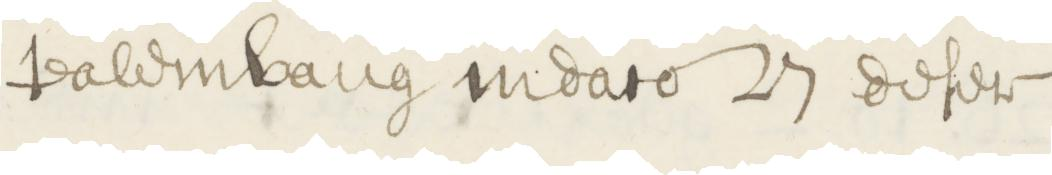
palembang in dato 27 deser
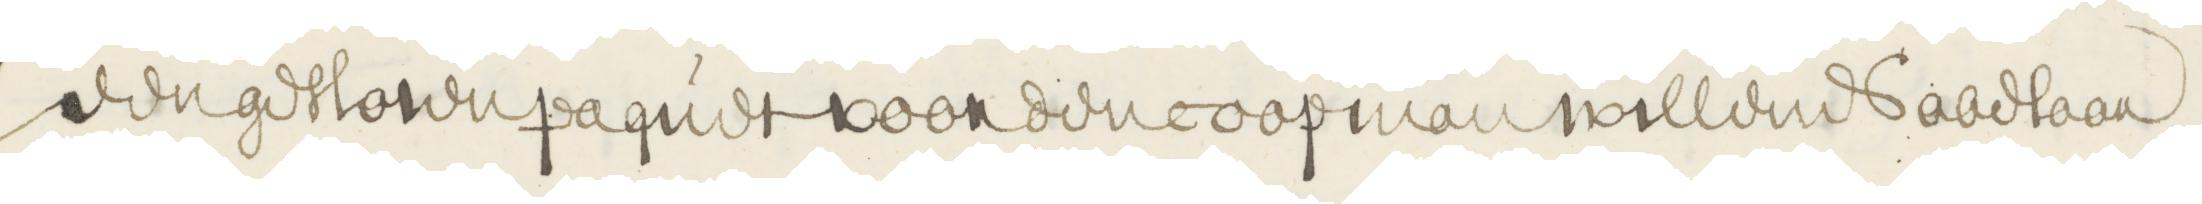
een gesloten paquet voorden coopman willem Sabelaar
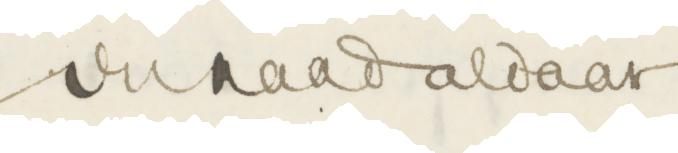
en Raad aldaar
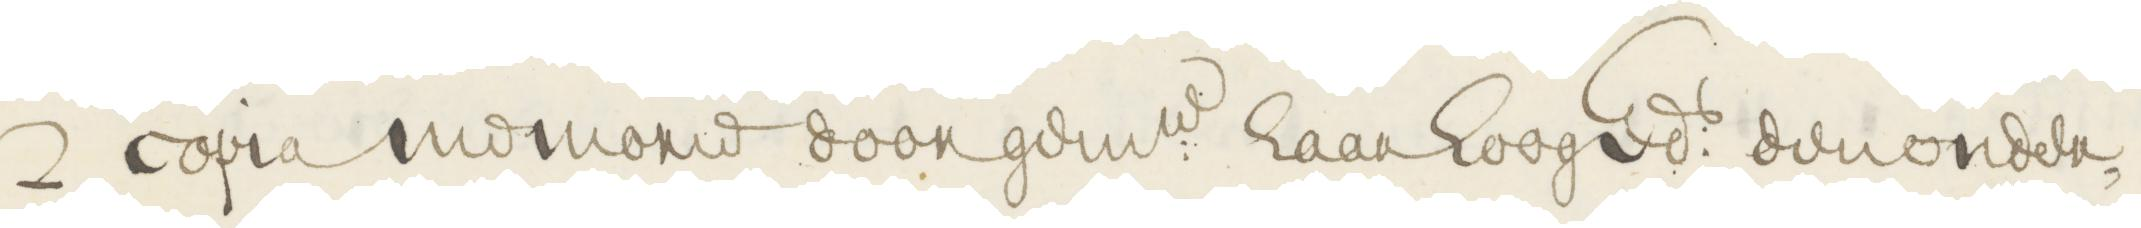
2 copia memorie door gem:te haar hoog Ed:s den onder,
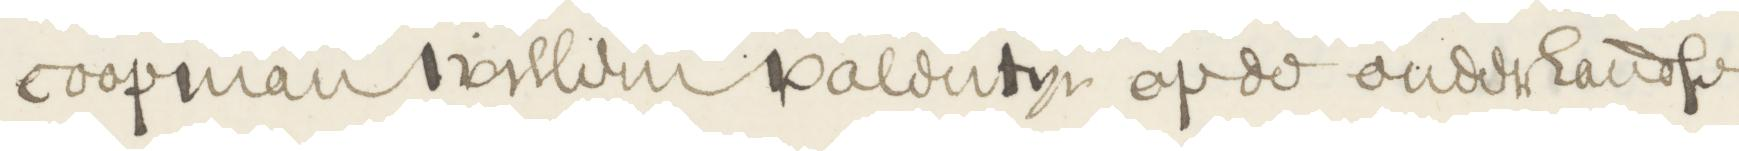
coopman willem valentijn op de onderhandse
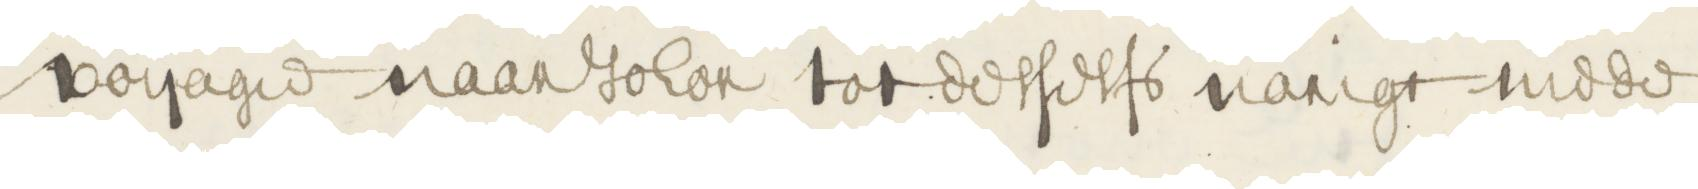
voijagie naar Johor tot desselfs narigt mede
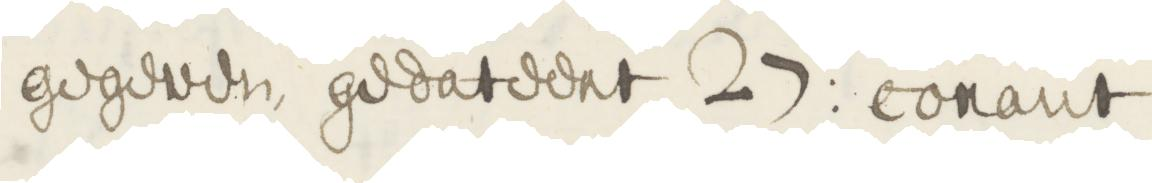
gegeven, gedateert 27': corant
